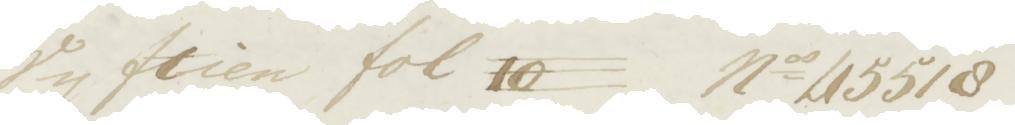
Vyftien fol 10 - N=os 45518
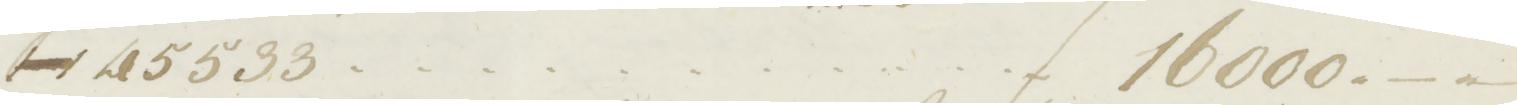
/—/ 45533 . . . . . . . . . . . . ƒ 16000 „ - „ -
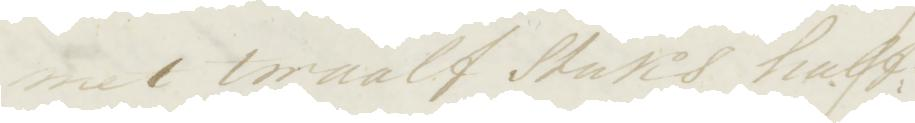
met twaalf stuks half„
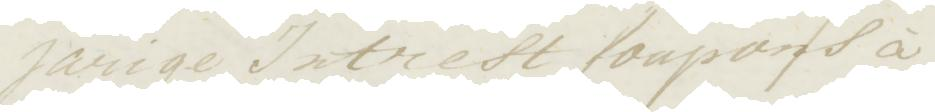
jarige Intrest coupons à
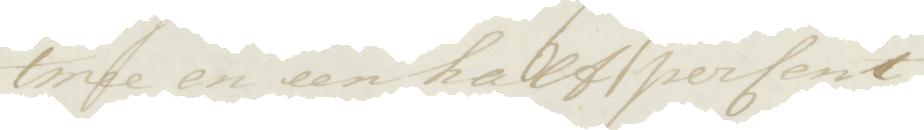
twee en een half perCent
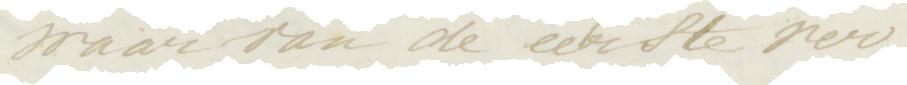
waar van de eerste ver
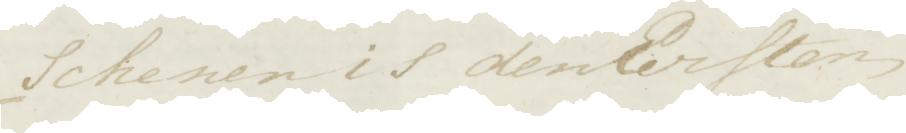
„schenen is den Eersten
